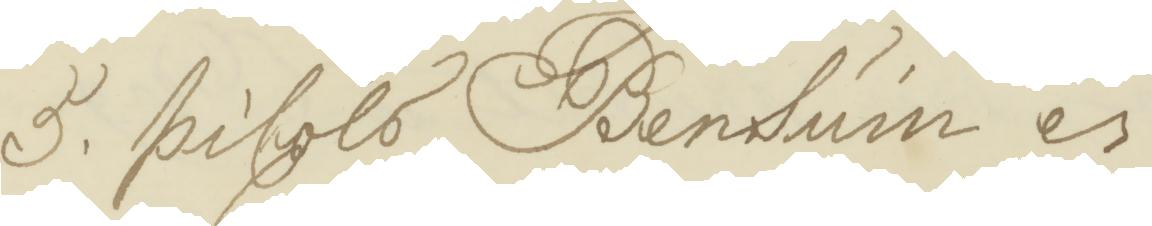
5. picols Bensuin en
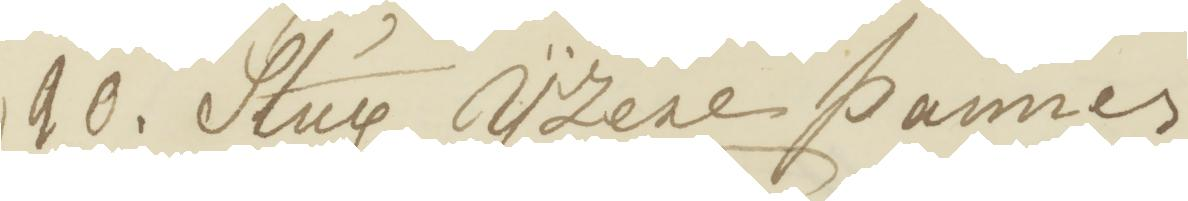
40. Stux ijzere pannen
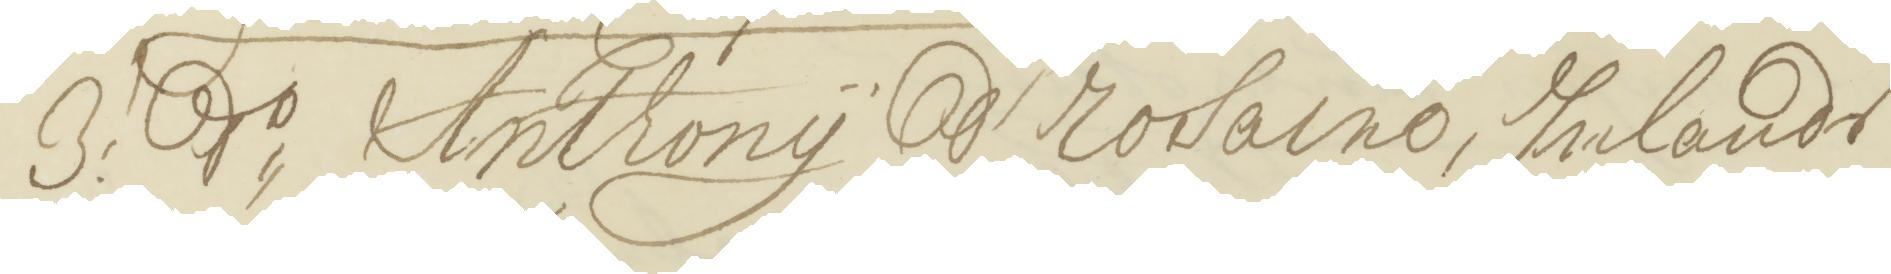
3:' d„o Anthonij d’ rosairo, Jnlands
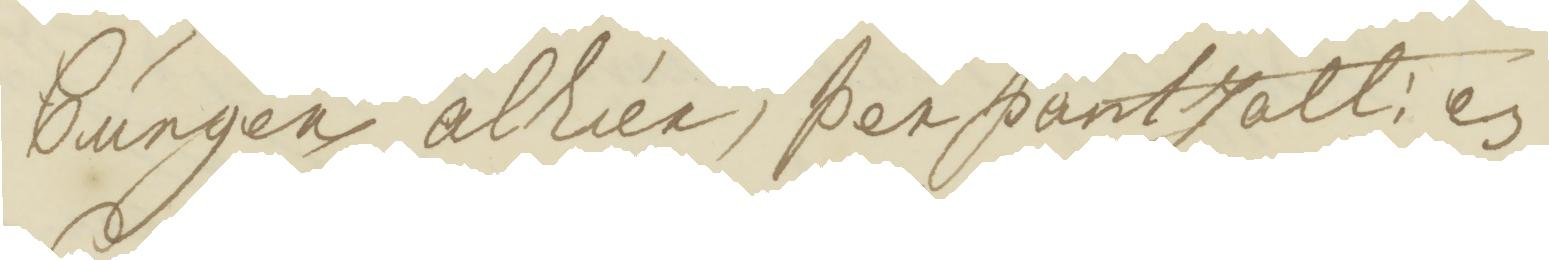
burger alhier, per pantjall: en
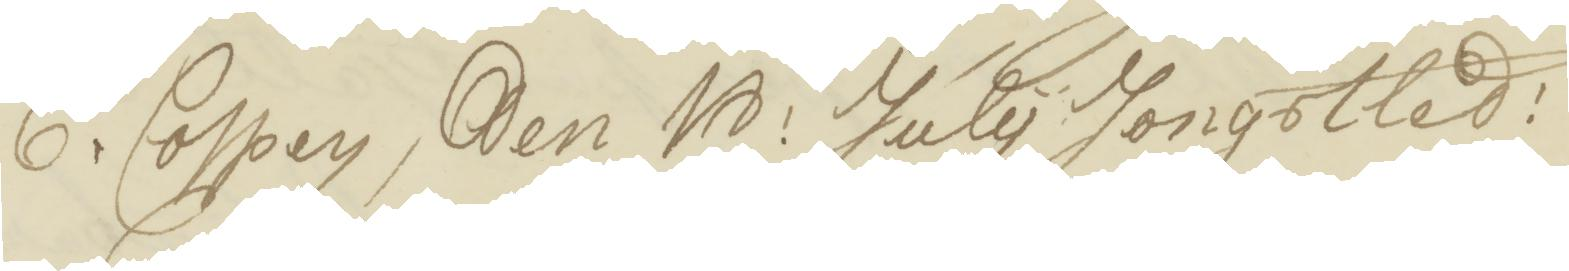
6. coppen, den 18:' Julij Jongstled:
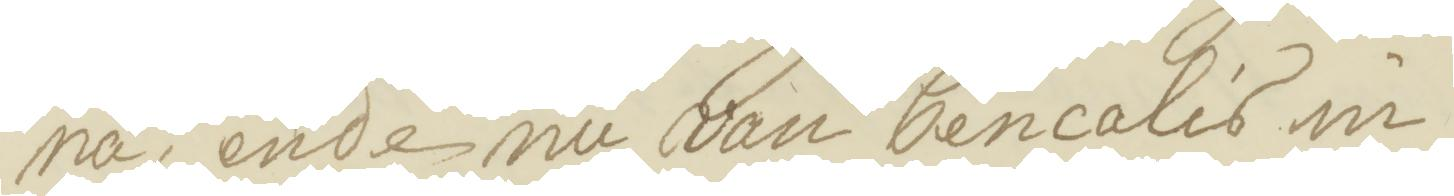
na, ende nu dan bencalis in
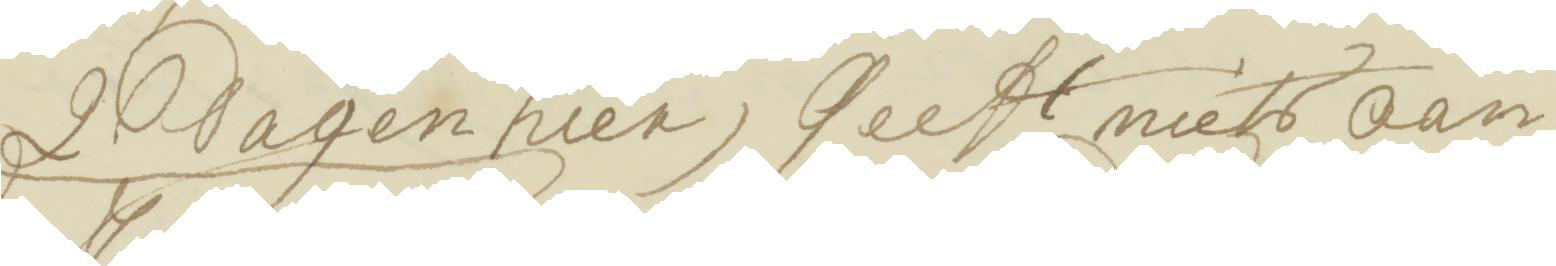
2. dagen hier, geeft niets aan
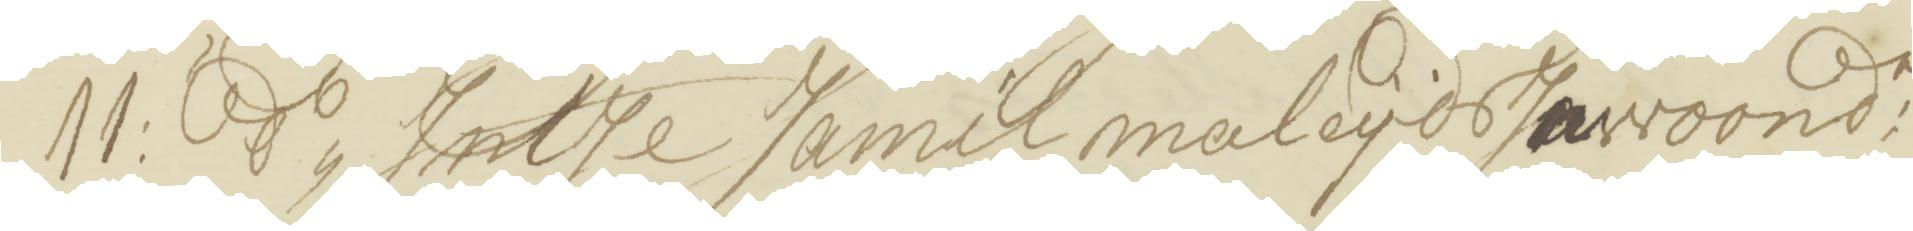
11:' d„o Jntje Jamil maleijds Jnwoond:r
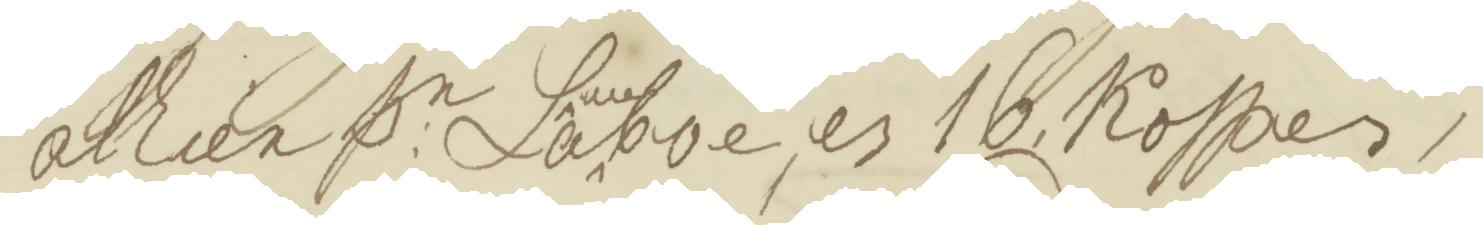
alhier p:rn Lamboe, en 16. koppen,
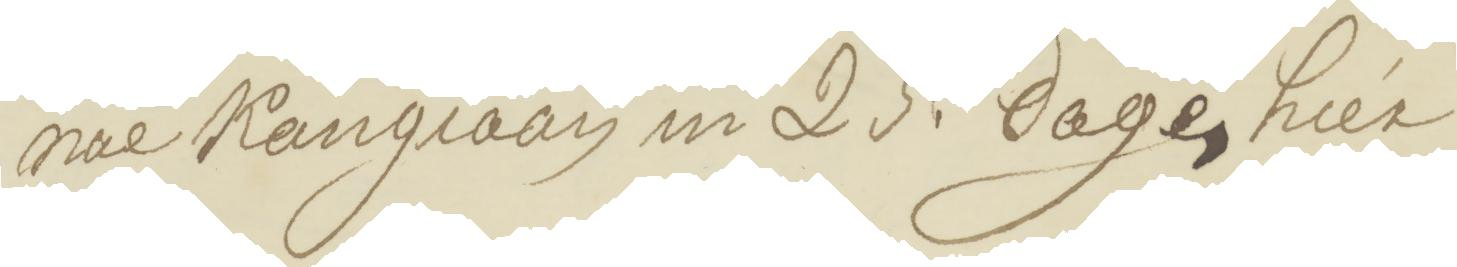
nae Kangiaan in 25: dagen hier
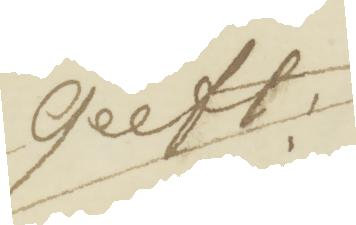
geeft./.
